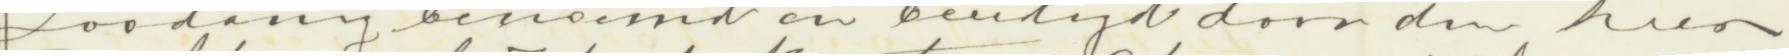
zoodanig benoemd en beëedigd door den heer
